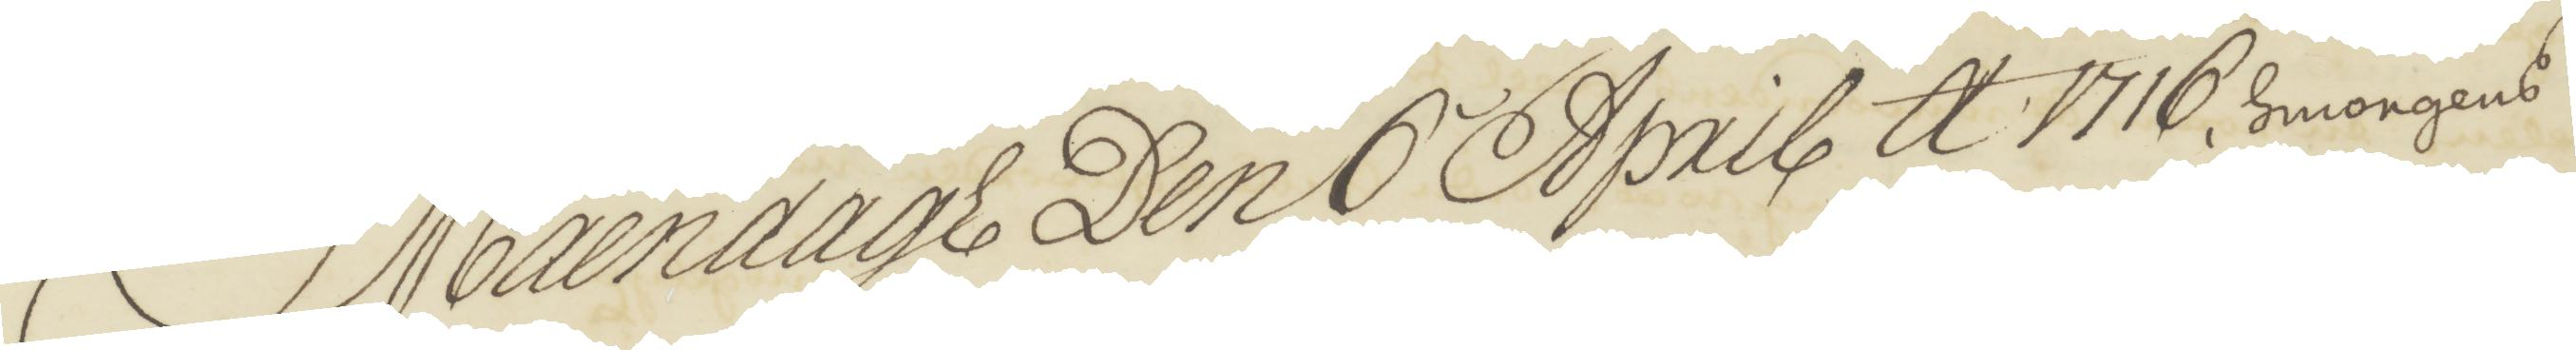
Maendagh Den 6' April a 1716, smorgens
